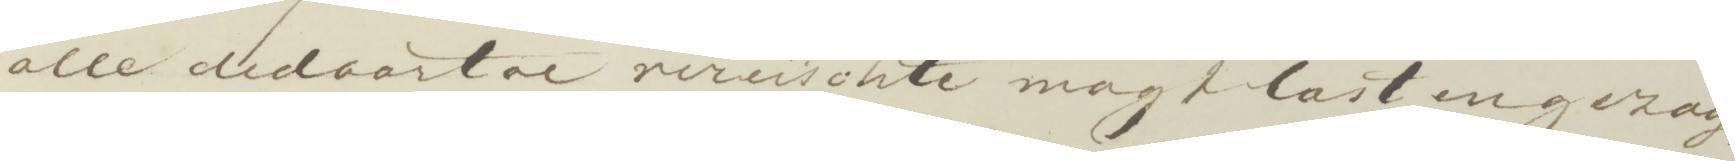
alle dedaartoe vereischte magt last en gezag
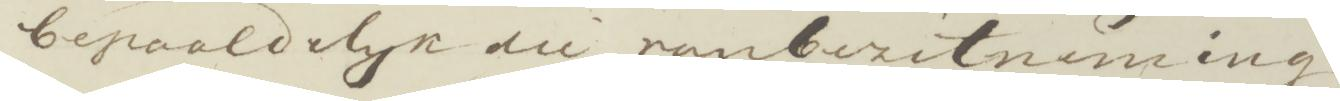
bepaaldelyk die vanbezitneming
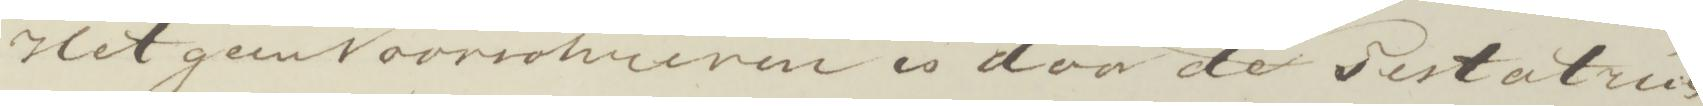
Het geen Voorschreven is door de Testatrice
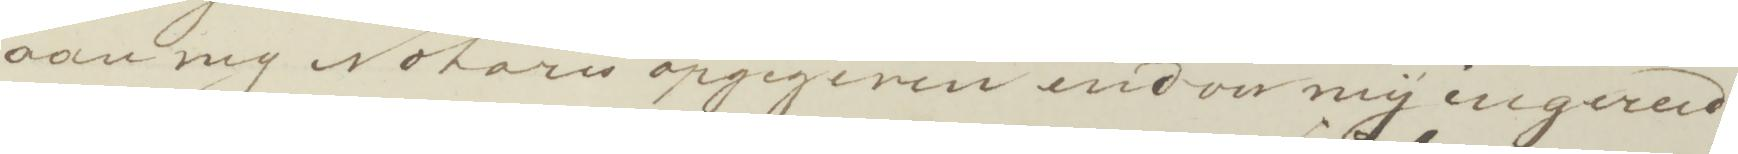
aan my Notaris opgegeven en door mij ingereed
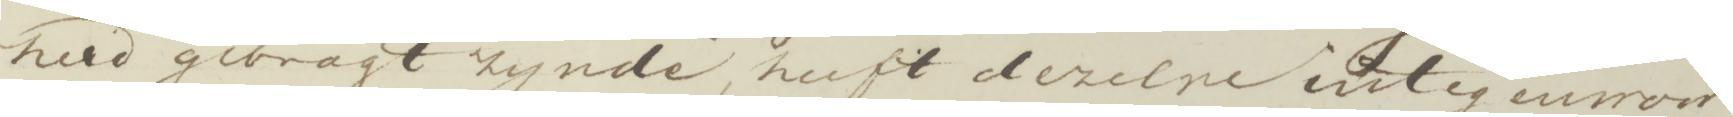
heid gebragt zynde heeft dezelve integenwoor
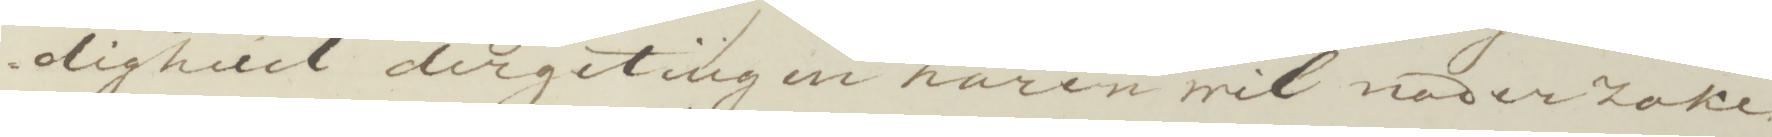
=digheid dergetuigen haren wil nader zake,
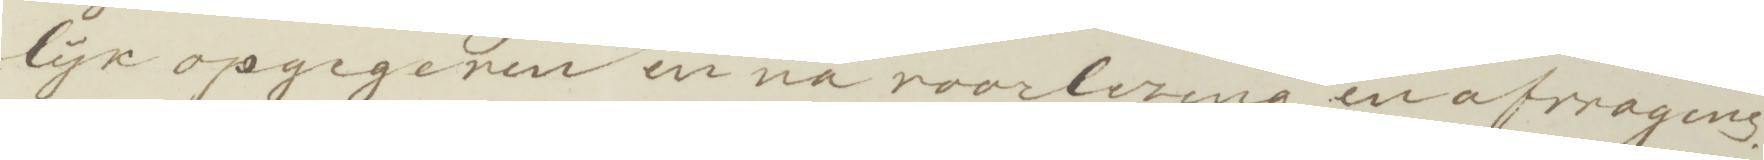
lijk opgegeven en na voorlezing en afvraging
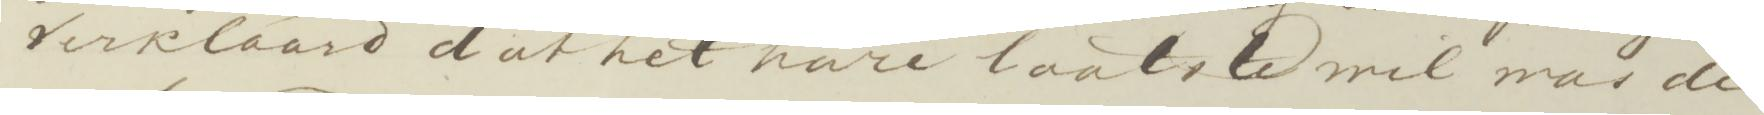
verklaard dat het hare laatste wil was die
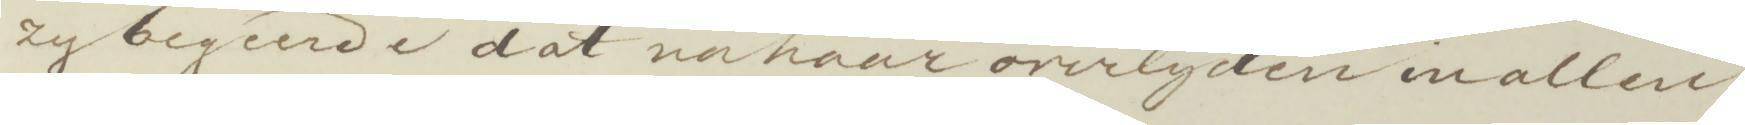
zy begeerde dat na haar overlyden in allen
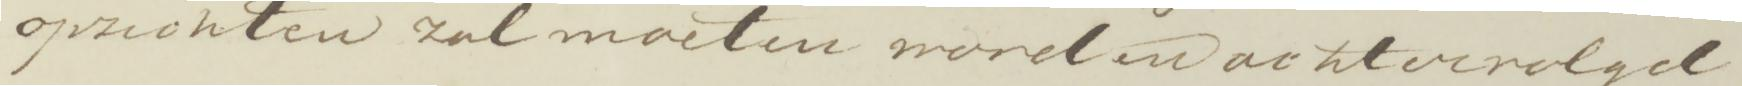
opzichten zal moeten worden achtervolgd
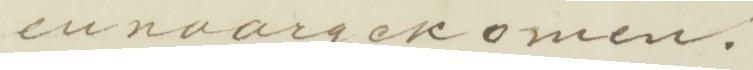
en naargekomen.
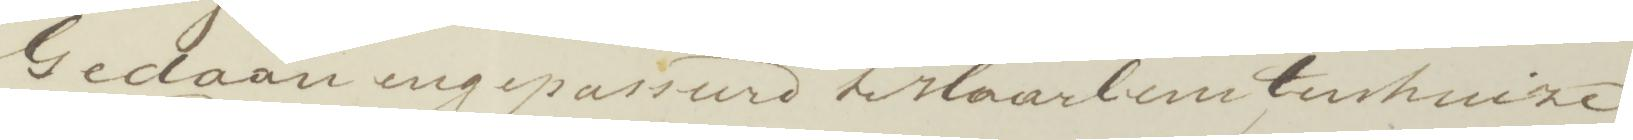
Gedaan engepasseerd teHaarlem tenhuize
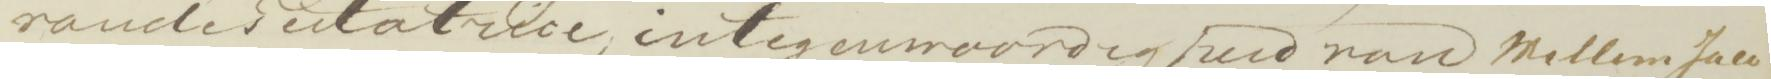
vande Testatrice, integenwoordigheid van Willem Jaco
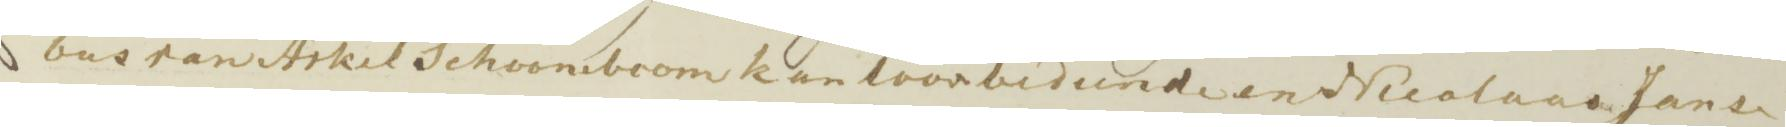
bus van Arkel Schoonebrom kantoorbediende en Nicolaas Jansen
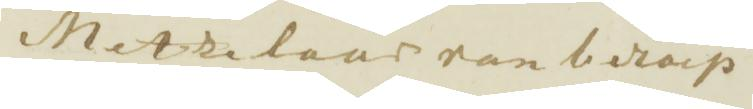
Metzelaar van beroep
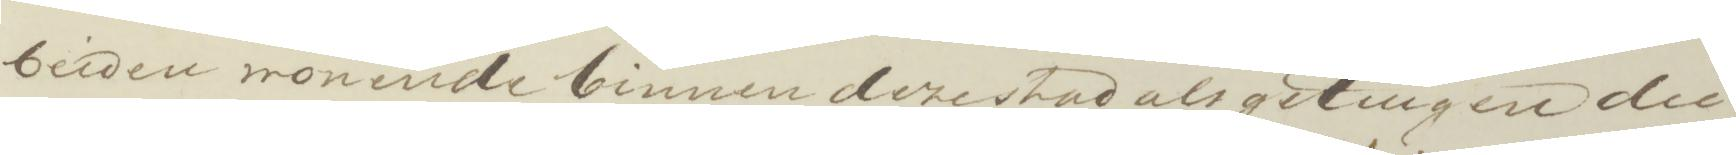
beiden wonende binnen dezestad als getuigen die
